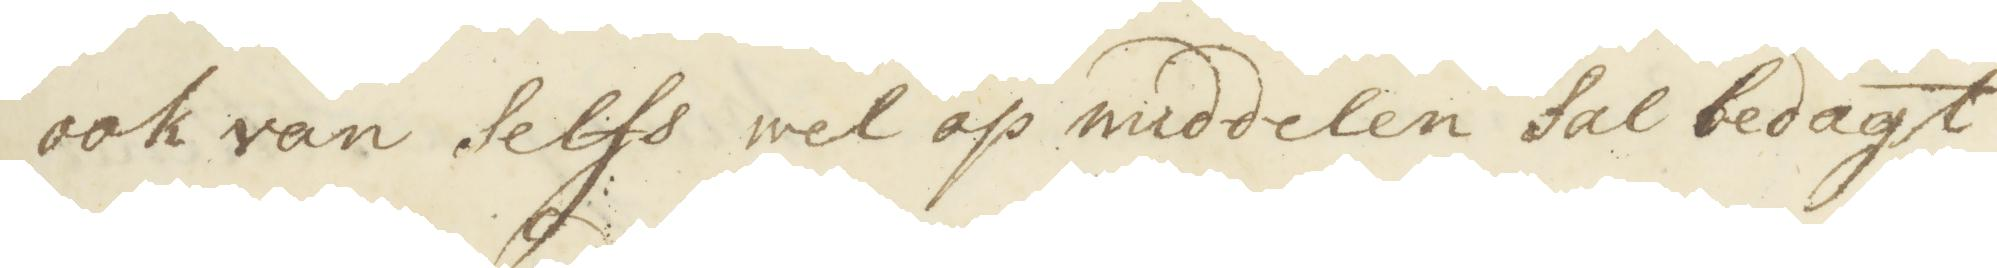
ook van selfs wel op middelen sal bedagt
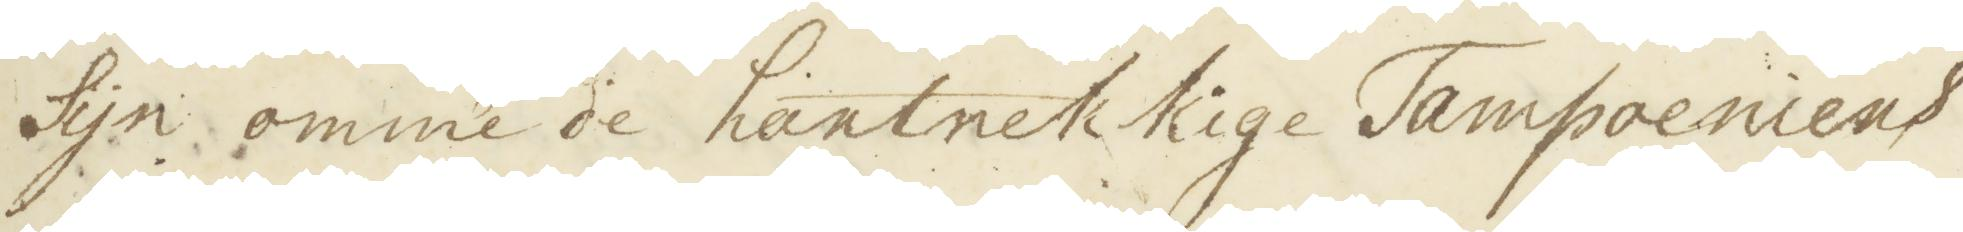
sijn omme de hartnekkige Tampoeniers
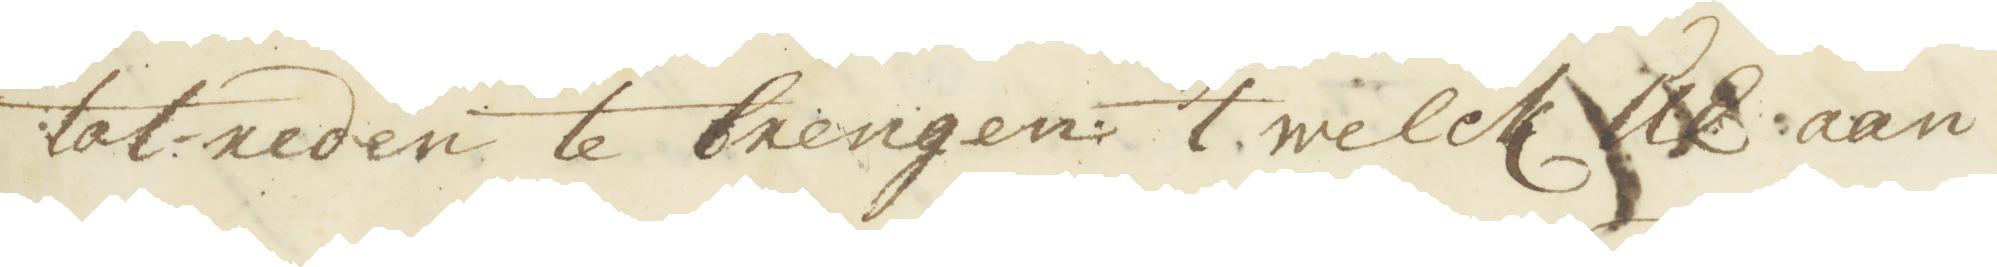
tot reden te brengen t welck UE: aan
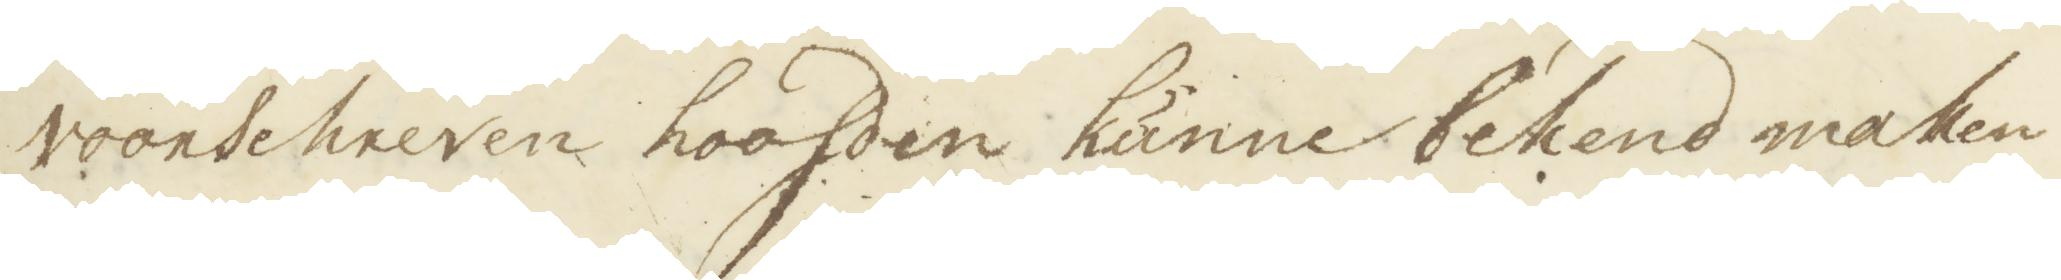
voorschreven hoofden kunne bekend maken
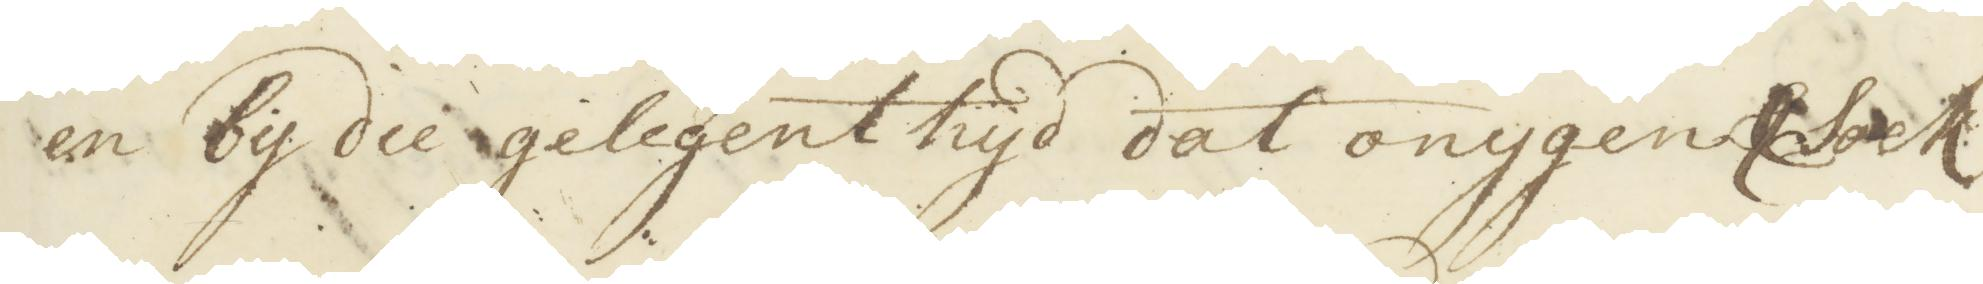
en bij die gelegenthijd dat onygen versoek
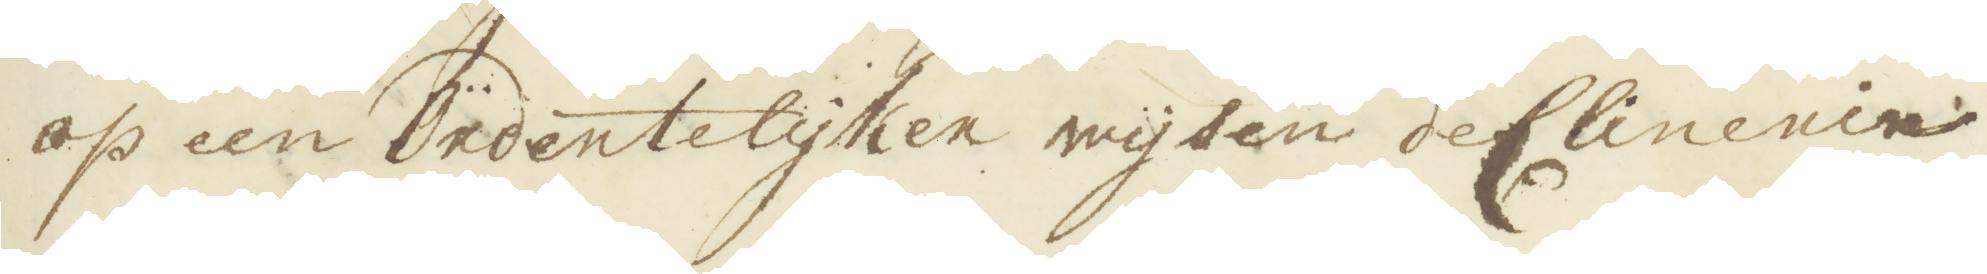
op een Ordentelijker wijsen deClinerin
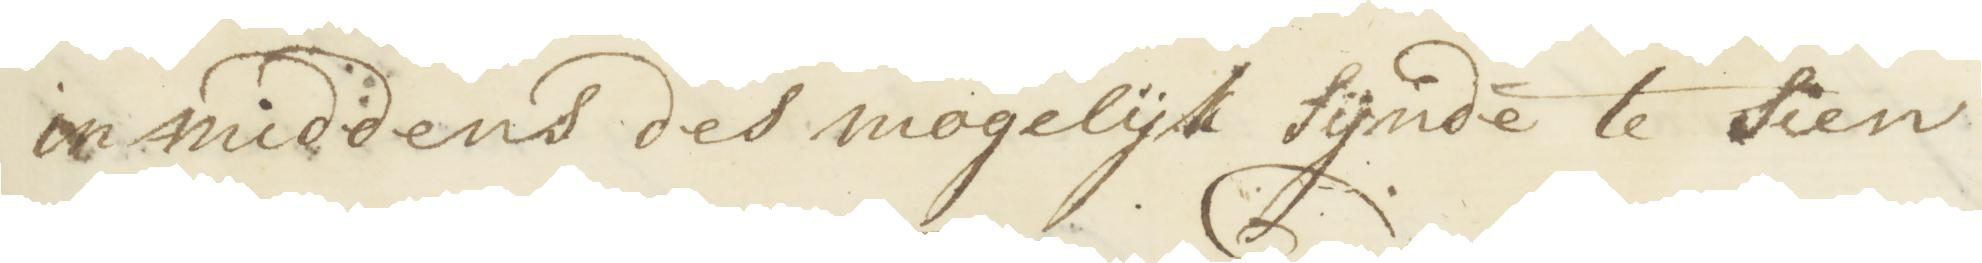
in middens des mogelijk sijnde te sien
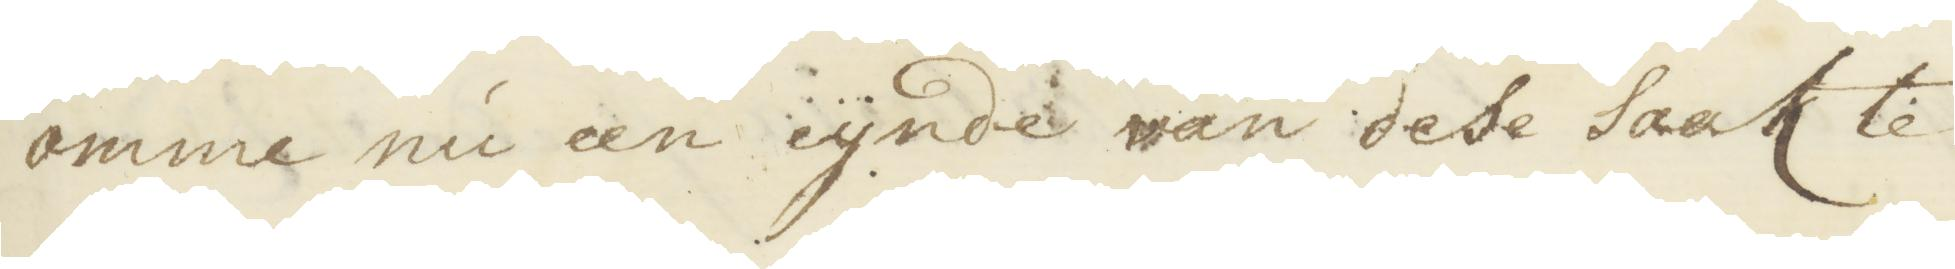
omme nu een eijnde aan dese saak te
